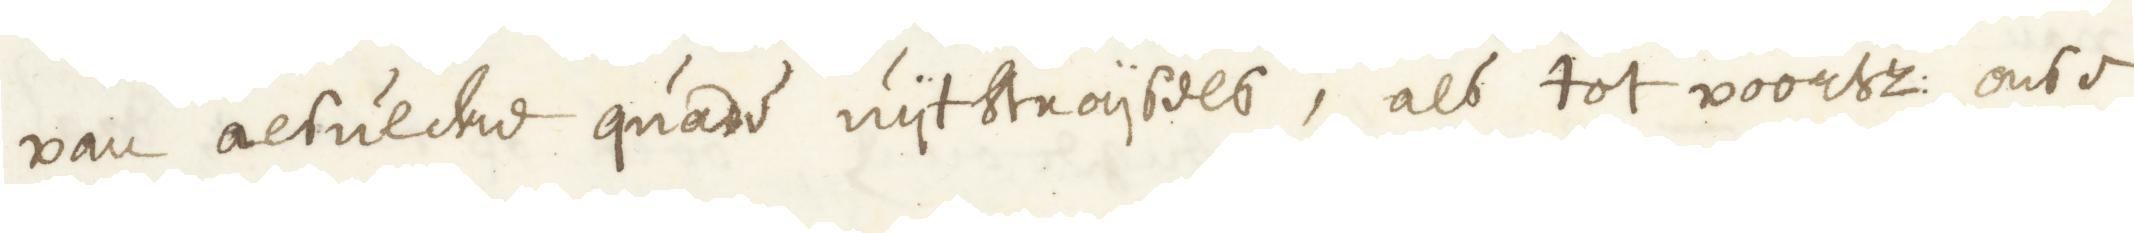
van alsulcke quade uijtstroijsels, als tot voorsz: onse
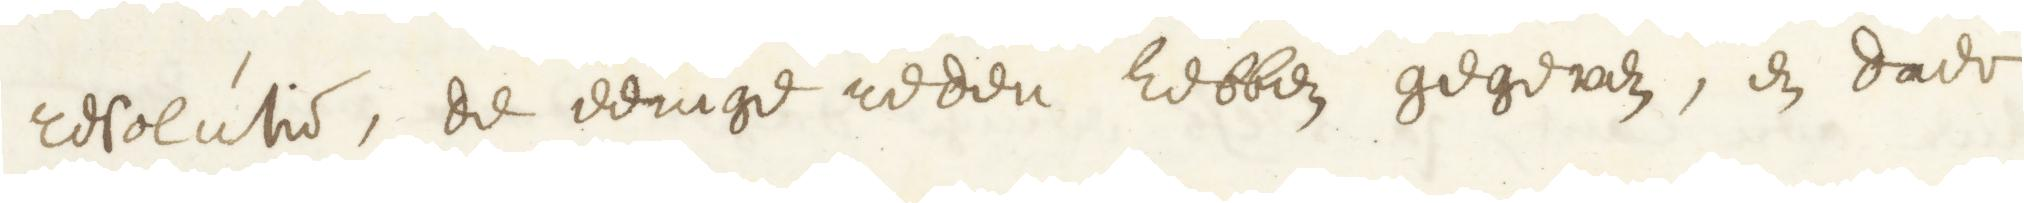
resolutie, de eenige reden hebben gegeven, en daer
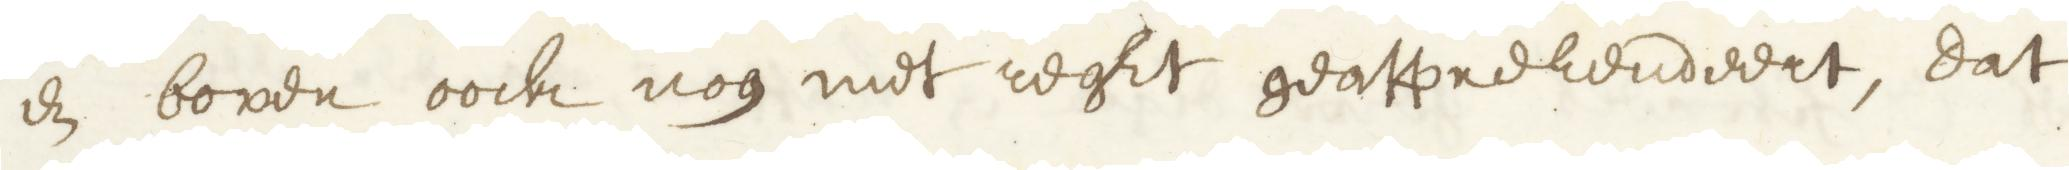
en boven oock nog met reght geapprehendeert, dat
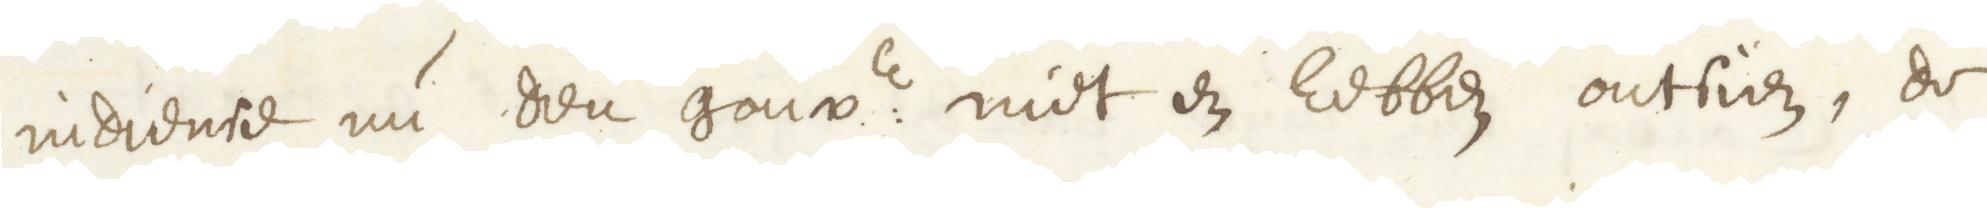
indiense nu den gouv:r niet en hebben ontsien, de
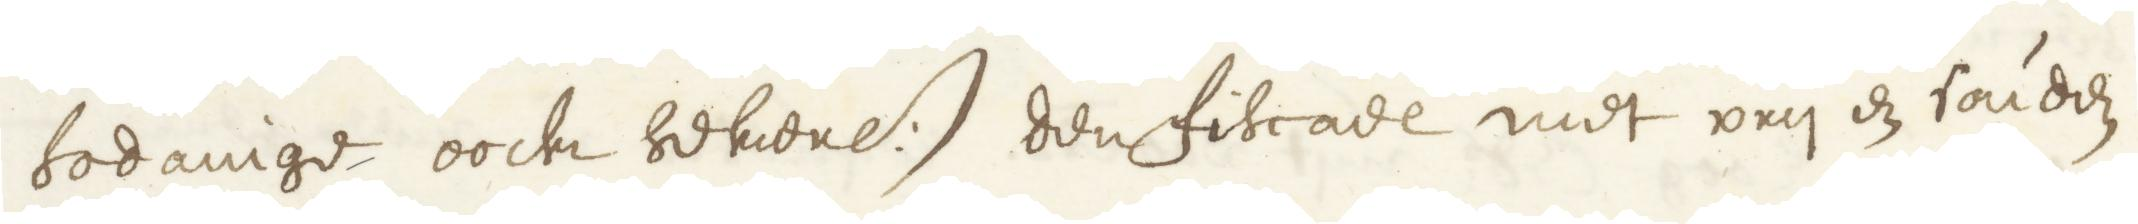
sodanige oock sekerlijk den fiscael niet vrij en souden
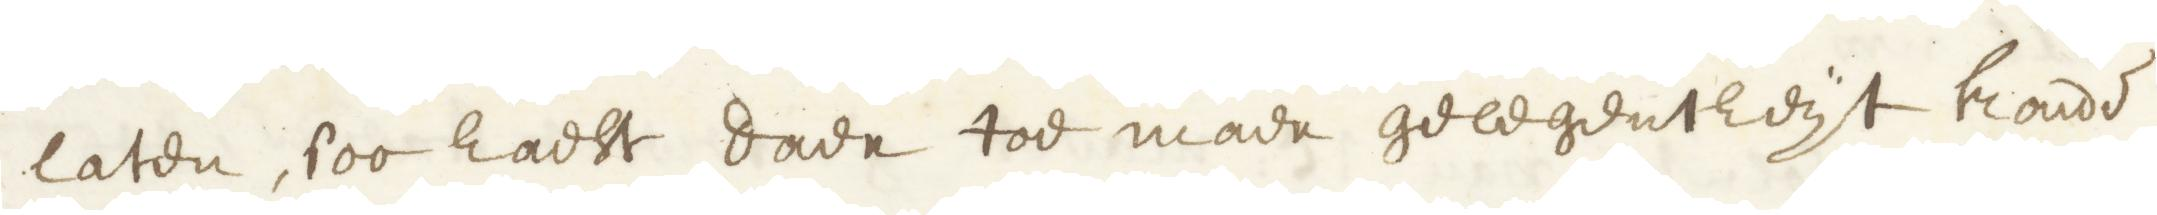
laten, soo haest daer toe maer gelegentheijt konde
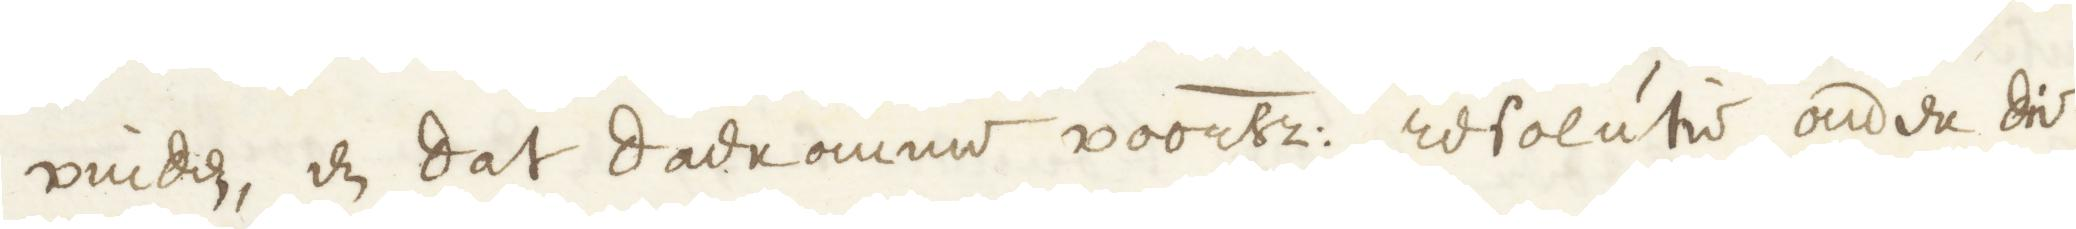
vinden, en dat daer omme voorsz: resolutie onder die
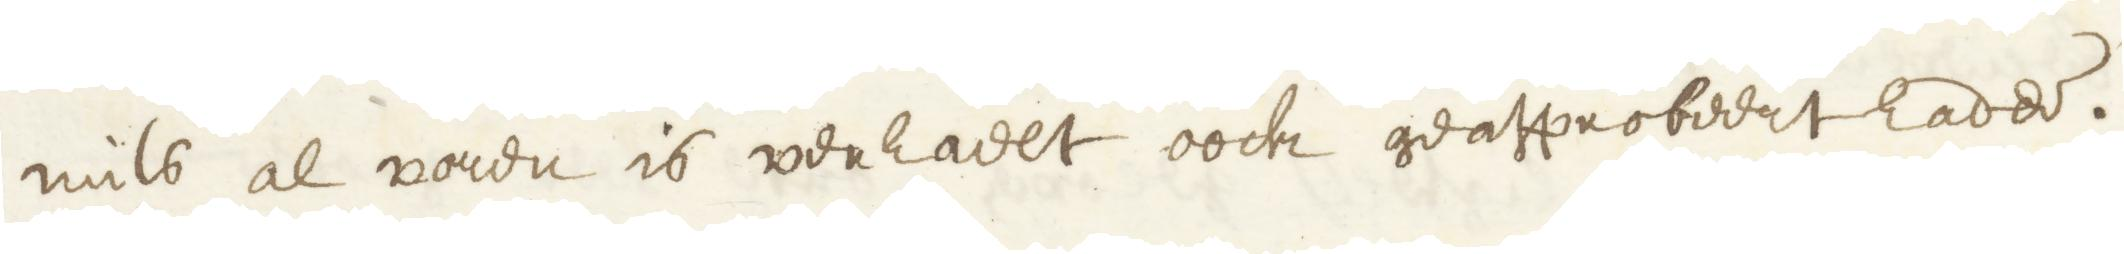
mits al voren is verhaelt oock geapprobeert hadde.
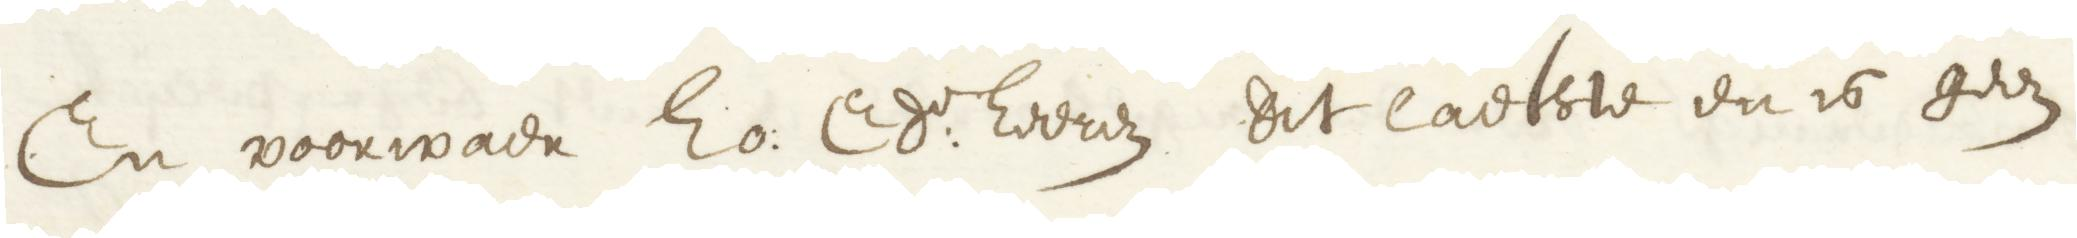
En voorwaer ho: Ed:e heeren dit laetste en is geen
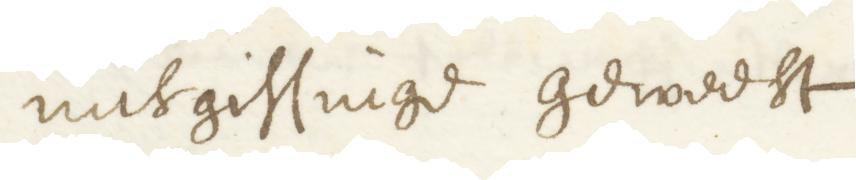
misgissinge geweest
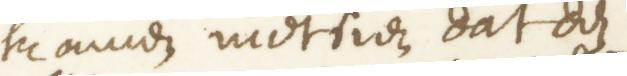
konnen niet sien dat den
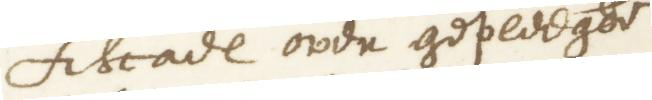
fiscael over gepleegde
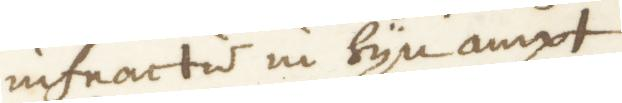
infractie in sijn ampt
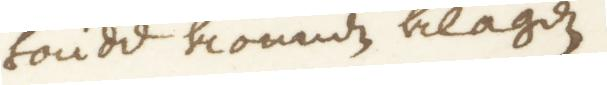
soude konnen klagen
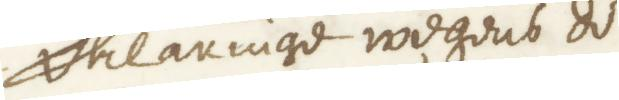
verklaringe wegens de
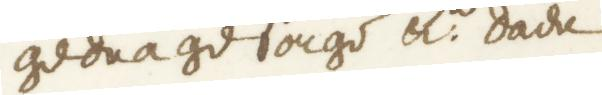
gedrage sorge &:a daer
